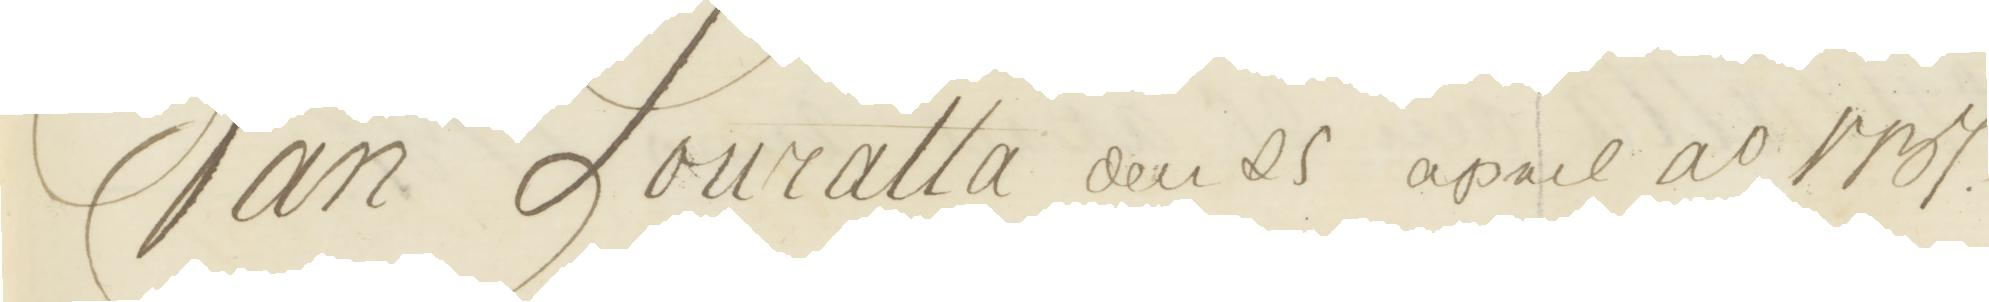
Van Souratta den 25 april Ao 1737.
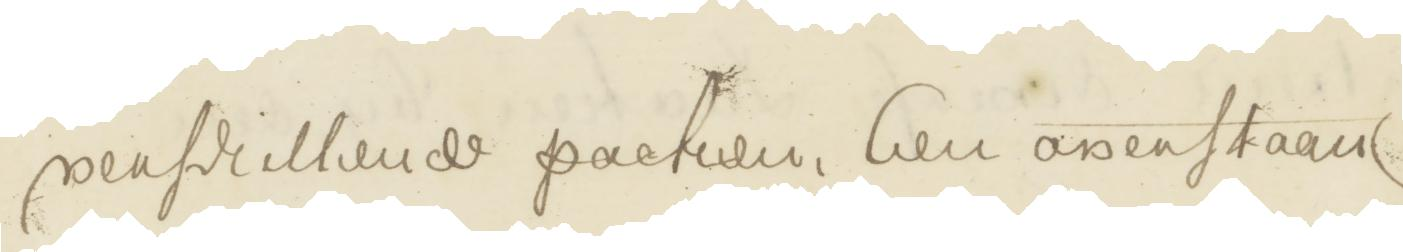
verschillende packen, ten overstaan
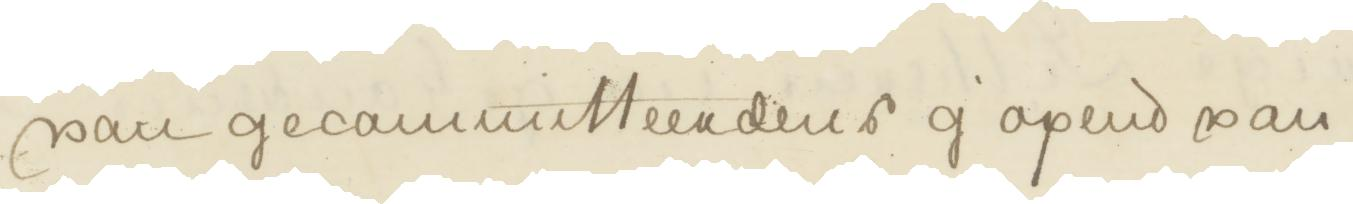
van gecommitteerdens g’opend van
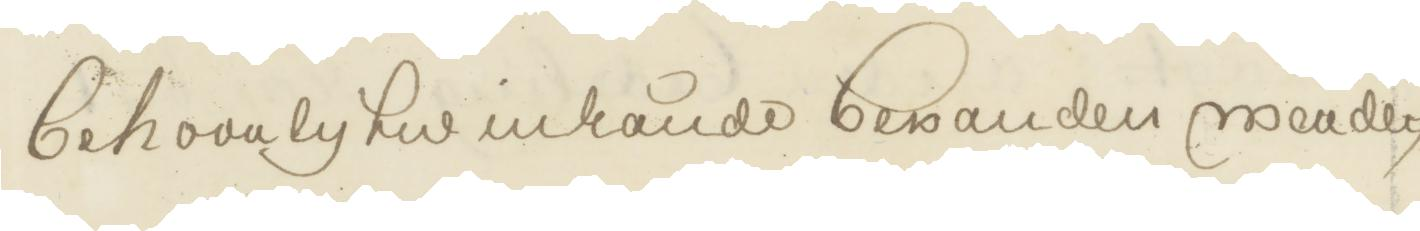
behoorlyke inhoude bevanden werden,
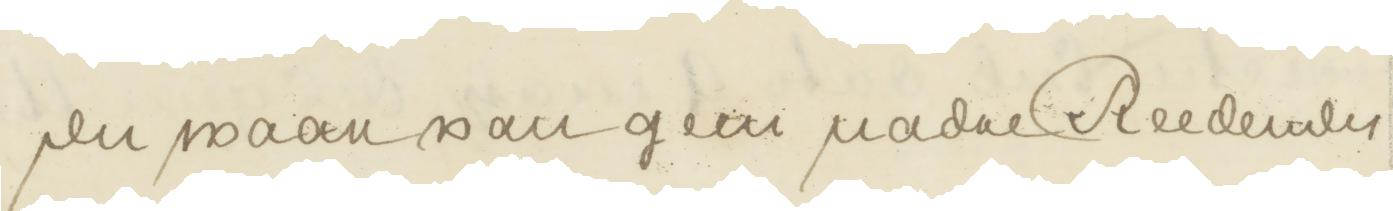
en waar van geen nadre Reedenen
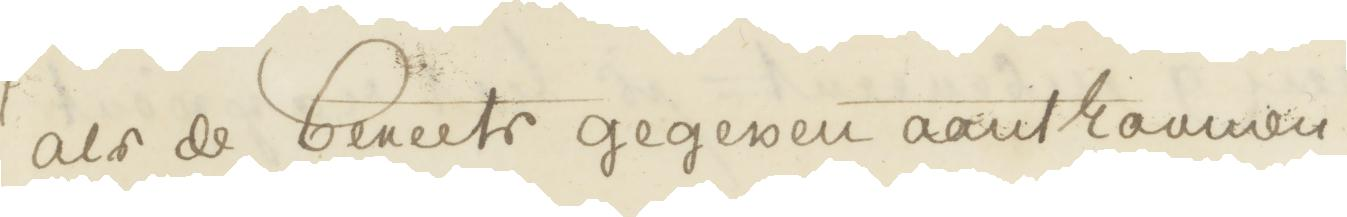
als de bereets gegeven aanthoonen
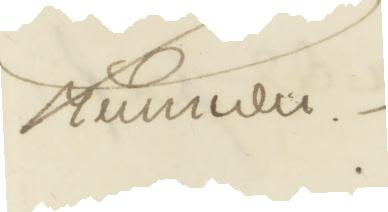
kunnen. —
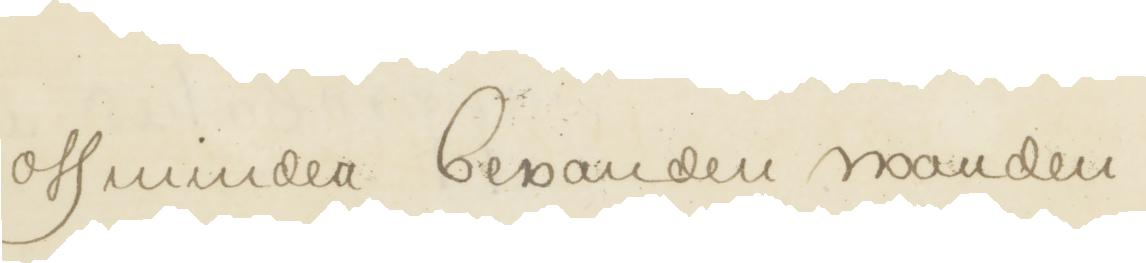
off minder bevanden warden
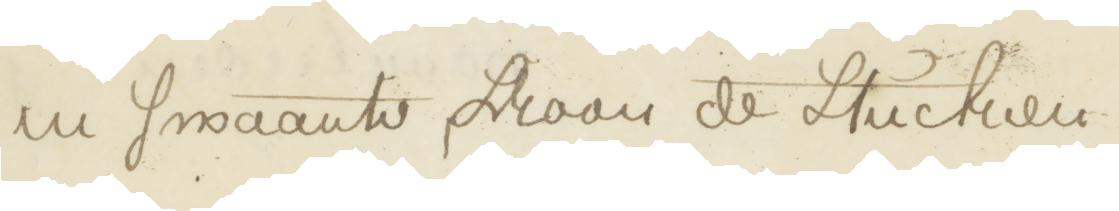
in swaarte schoon de stucken
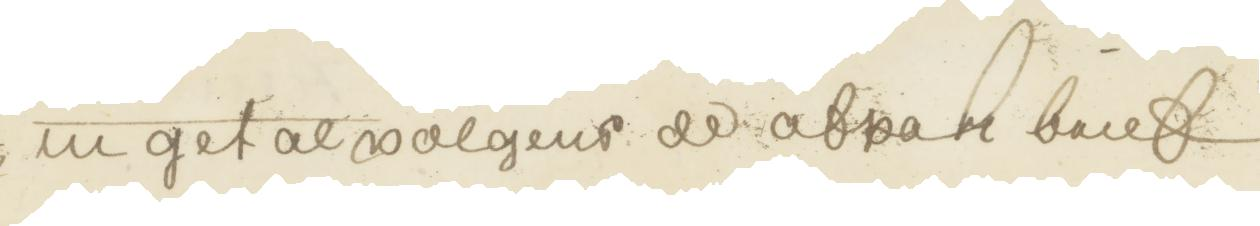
in getal volgens de afpak brief
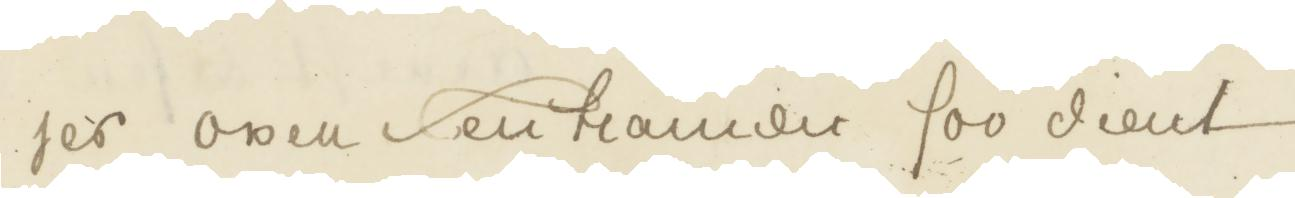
jes over Eenkamen soo dient
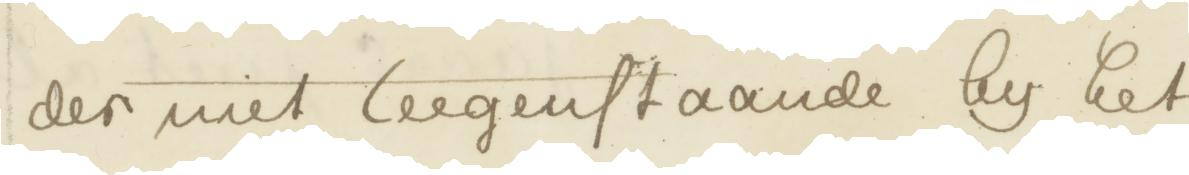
des niet teegenstaande by het
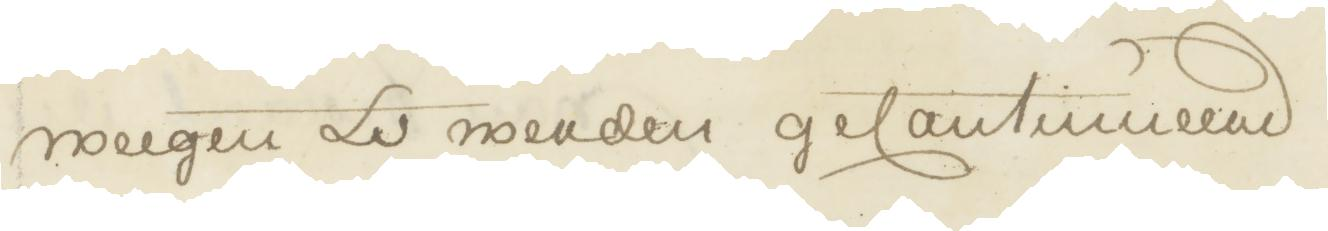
weegen te werden gecantinueerd
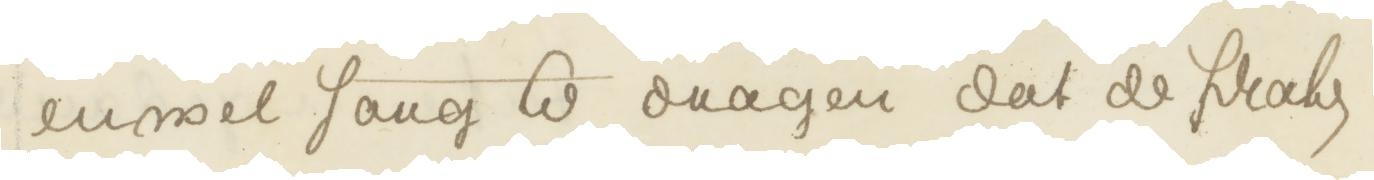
en wel Jang te dragen dat de schaken
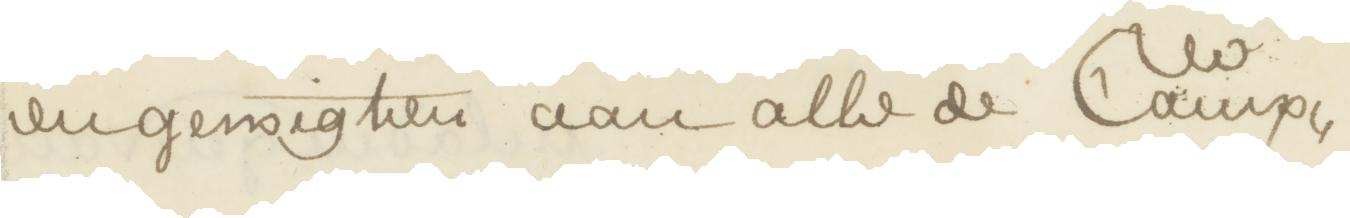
en gewigtien aan alle de Camp„
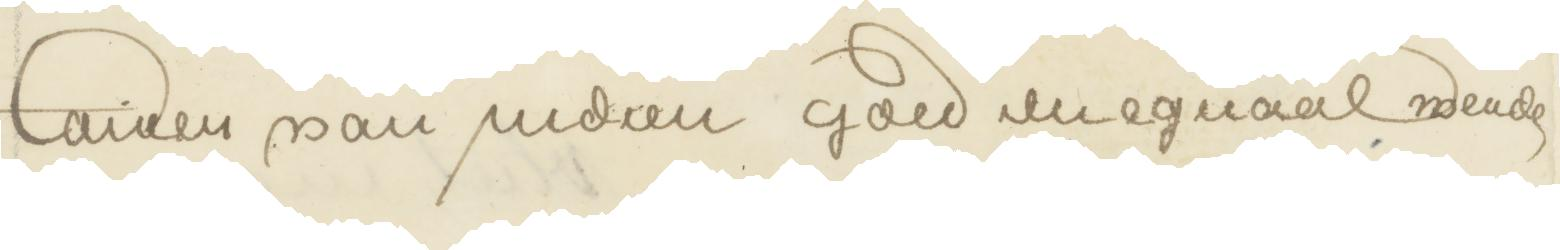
tairen van indien goed en eguaal werden
